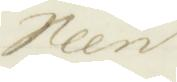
Veen
